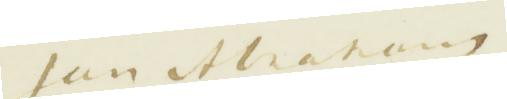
Jan Abraham
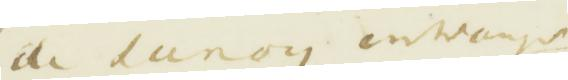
de Lanoy ontvanger
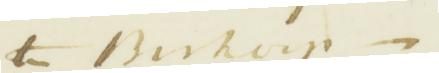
te Boskoop
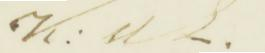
K. v L.
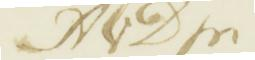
AvDjr
